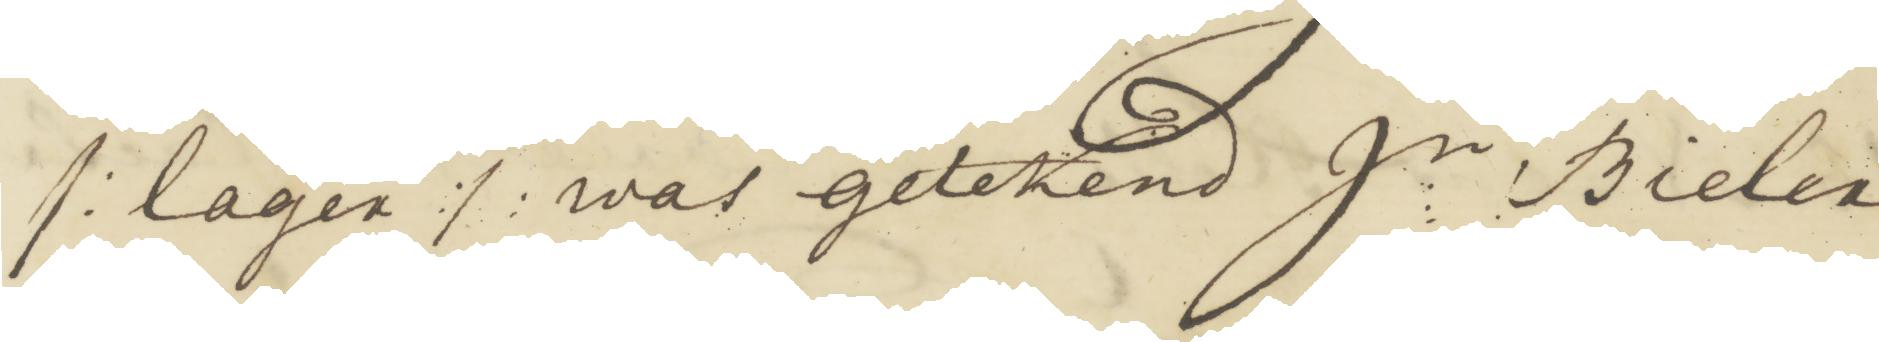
/:lager:/ : was getekend J:n Bieler
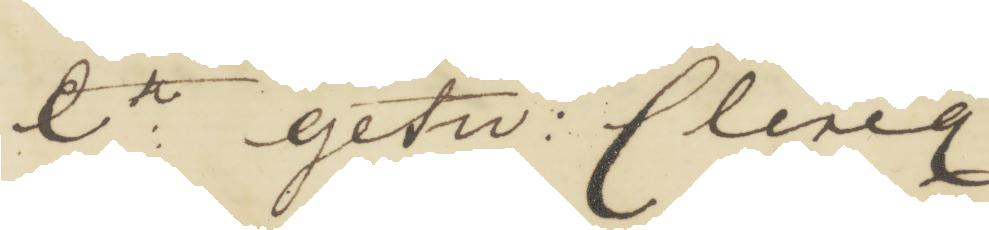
E:te gesw: Clercq
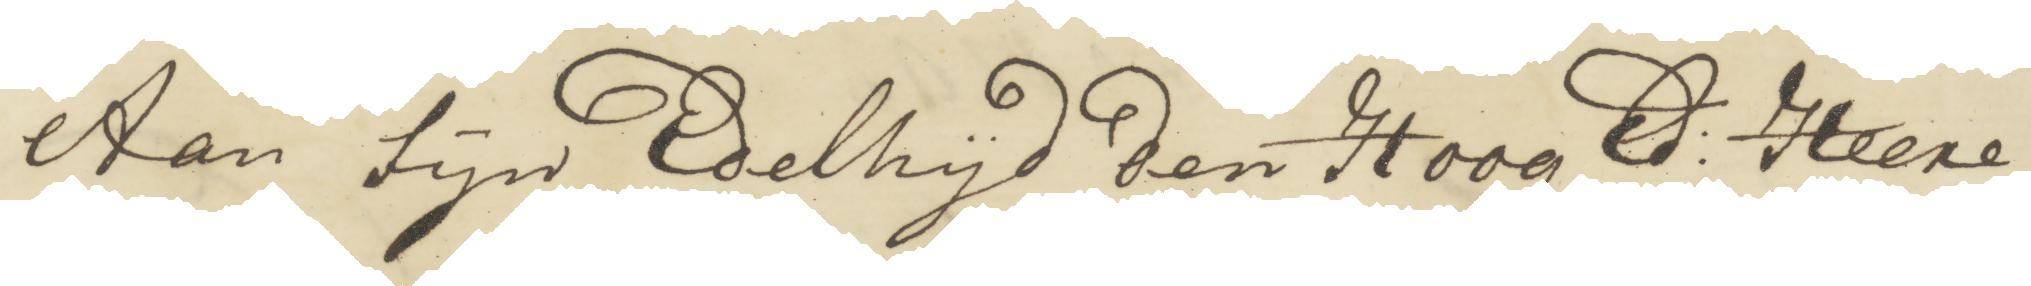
Aan sijn Edelhijd den Hoog Ed: Heere
